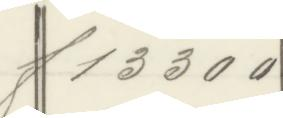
ƒ 13300
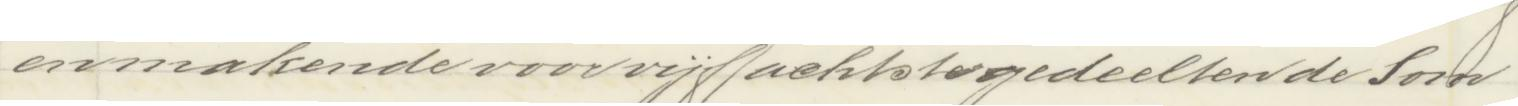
en makende voor vijf/achtste gedeelten de som
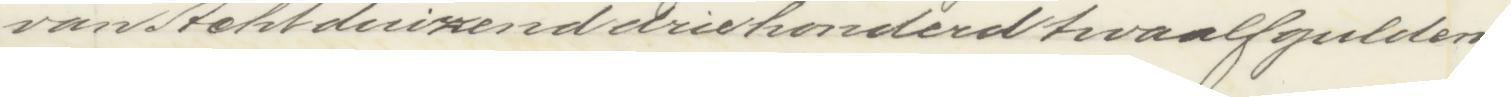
van Acht duizend drie honderd twaalf gulden
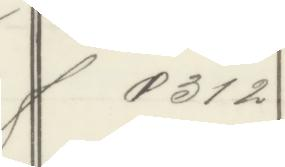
ƒ 8312
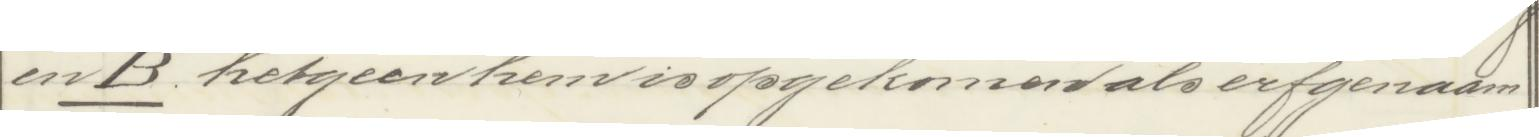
en B. hetgeen hem is opgekomen als erfgenaam
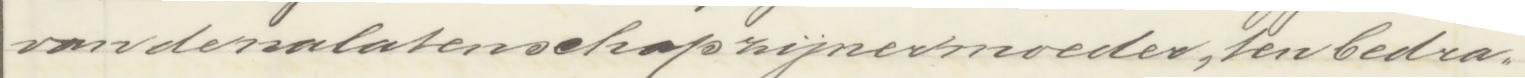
van de nalatenschap zijner moeder, ten bedra„
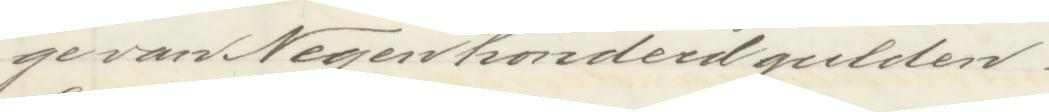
ge van Negen honderd gulden
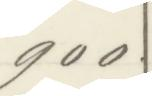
900.
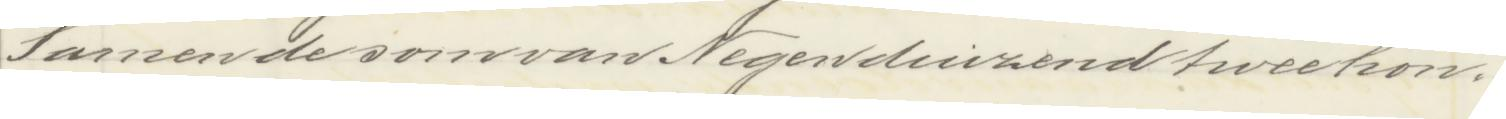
samen de som van Negen duizend tweehon„
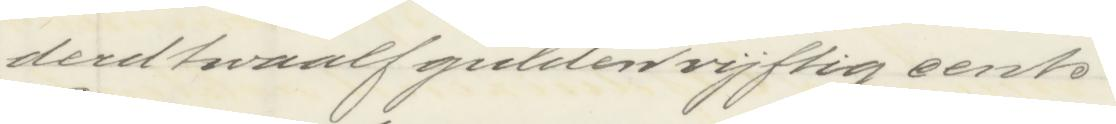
derd twaalf gulden vijftig cents
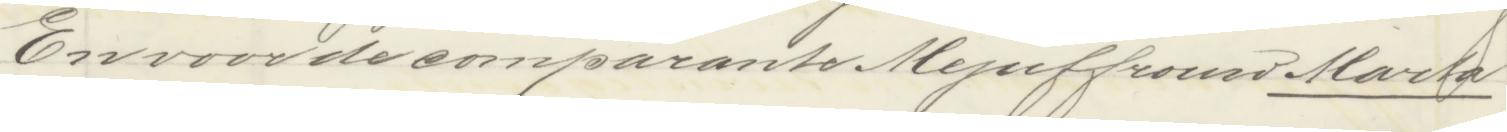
En voor de comparante Mejuffrouw Marta
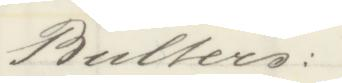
Bulters:
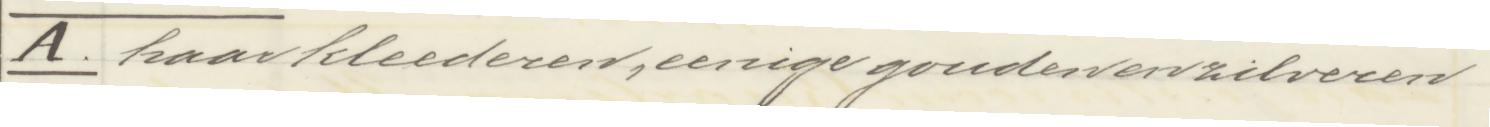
A. haar kleederen, eenige gouden en zilveren
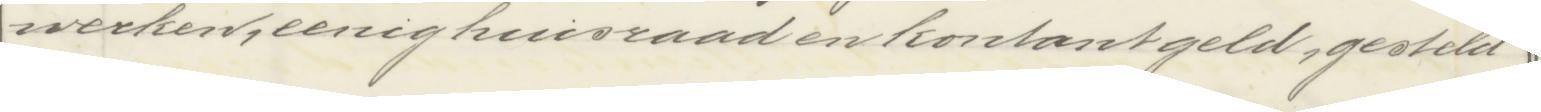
werken, eenig huisraad en kontant geld, gesteld
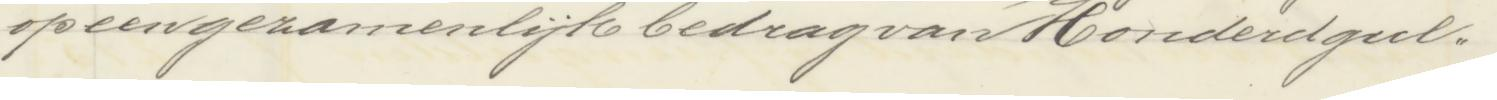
op een gezamenlijk bedrag van Honderd gul„
